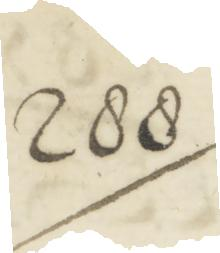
288
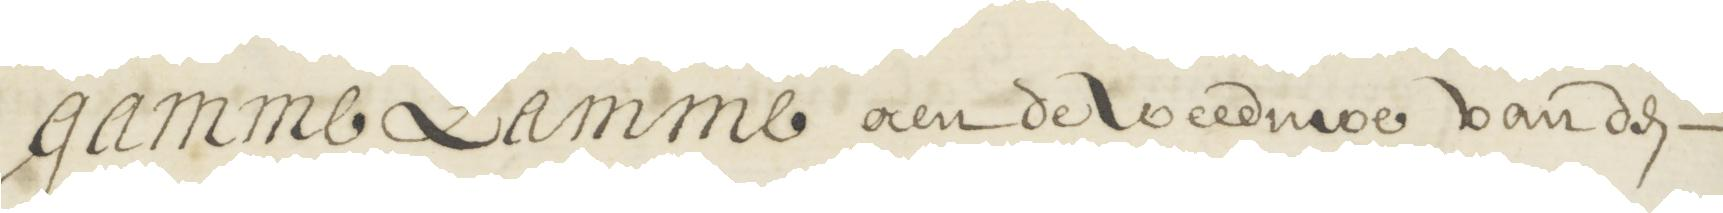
gamme Lamme aen de weeduwe van den —
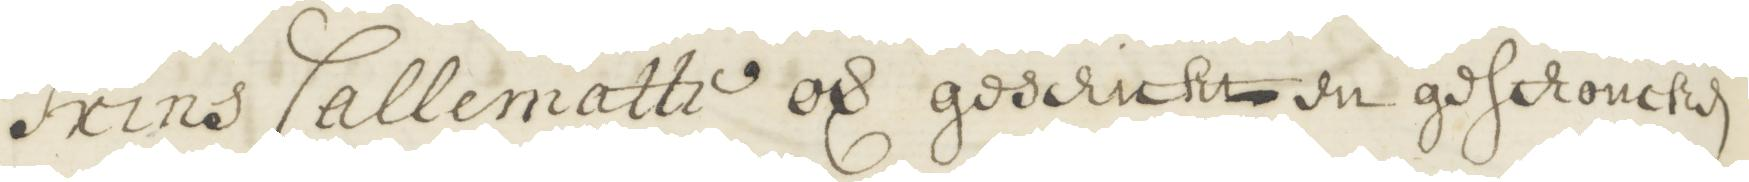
Prins Callematte over geschickt en geschoncken
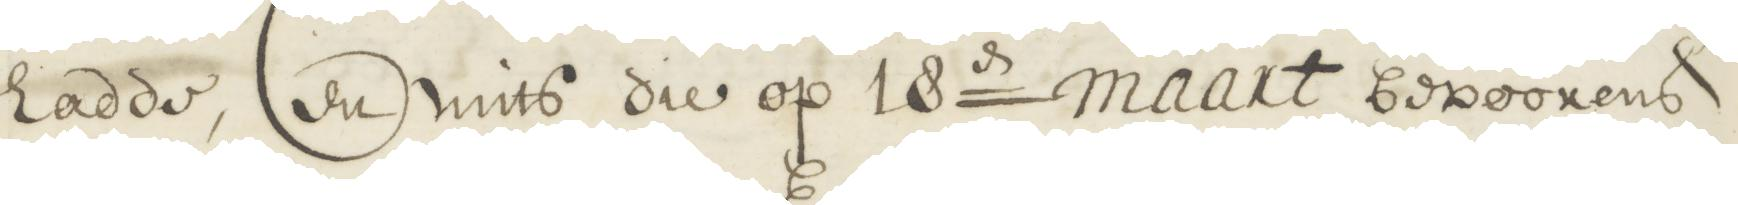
hadde, en mits die op 18=en maart bevoorens
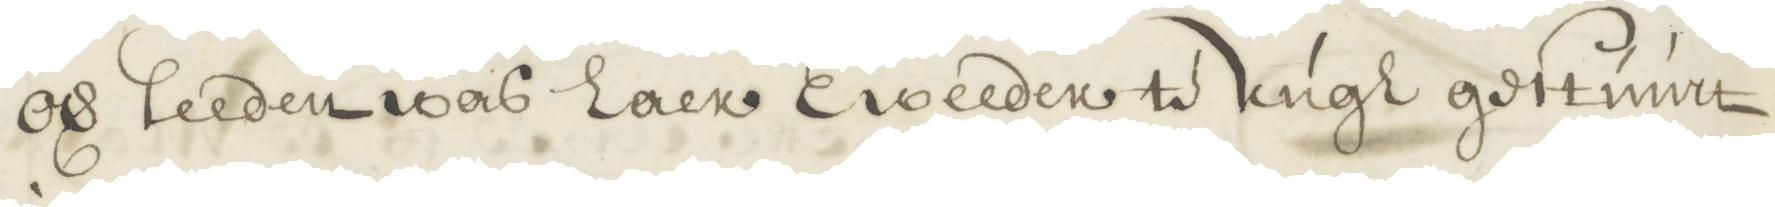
overleeden was haer E weeder te rugh gestuurt
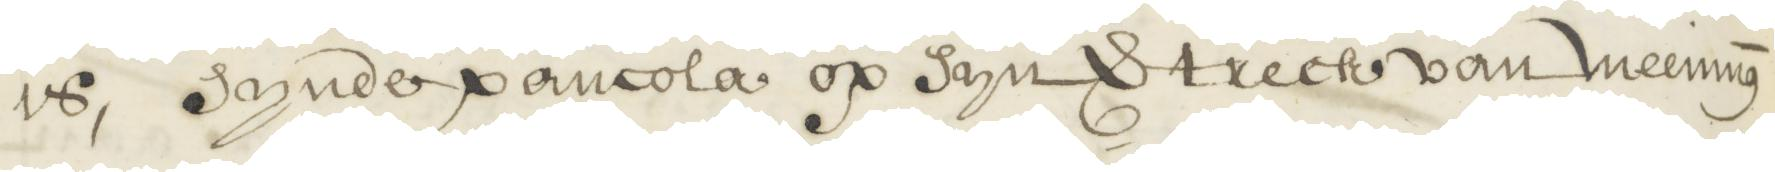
is, synde pancola op syn vertreck van meening
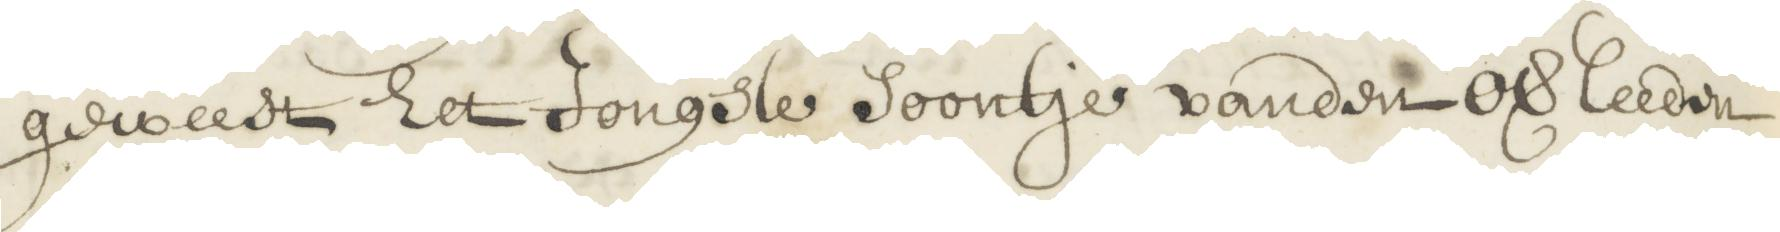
geweest het Iongste soontje vanden overleeden
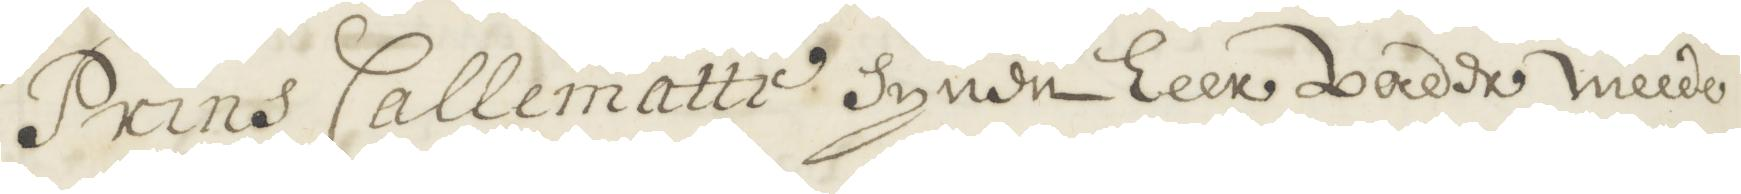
Prins Callematte synen heer vader meede
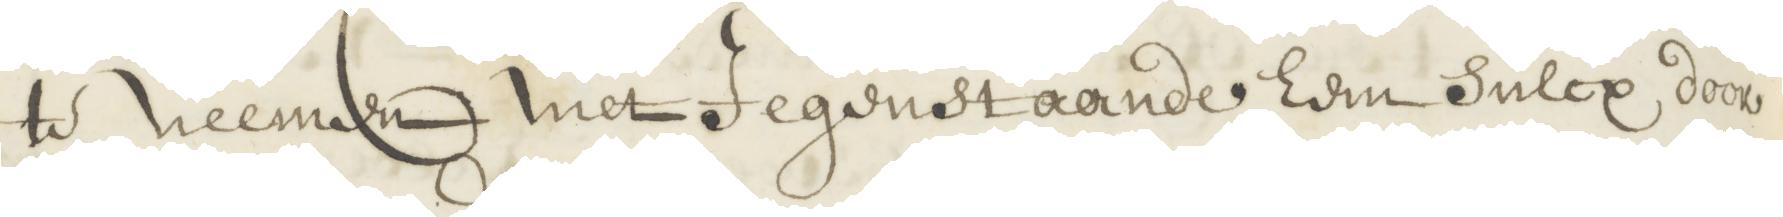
te neemen niet tegenstaande hem sulcx, door
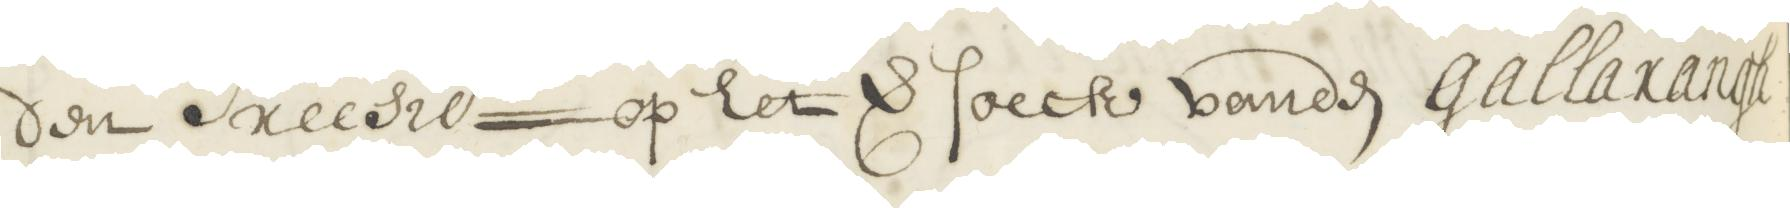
den Preesid=t op het versoeck vanden gallarangh
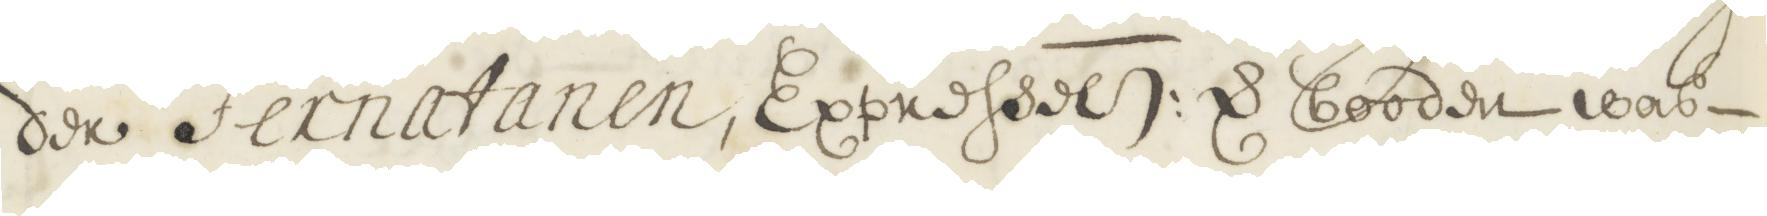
der Ternatanen, Expresselijk verbooden was —
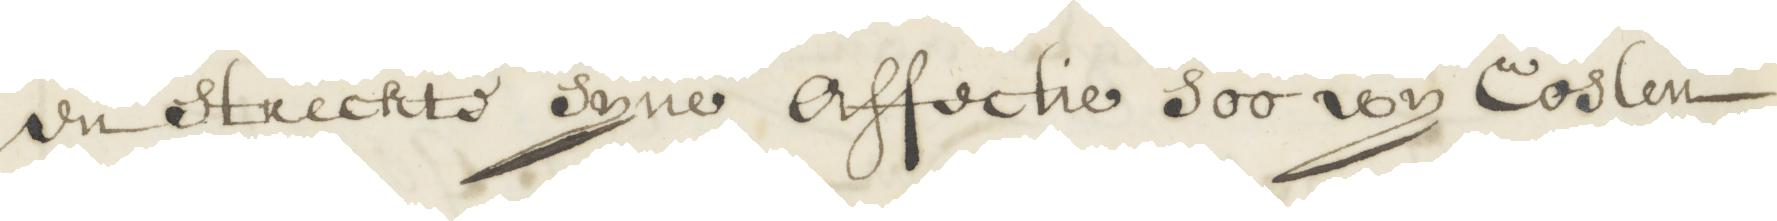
en streckte syne affectie soo wy Costen
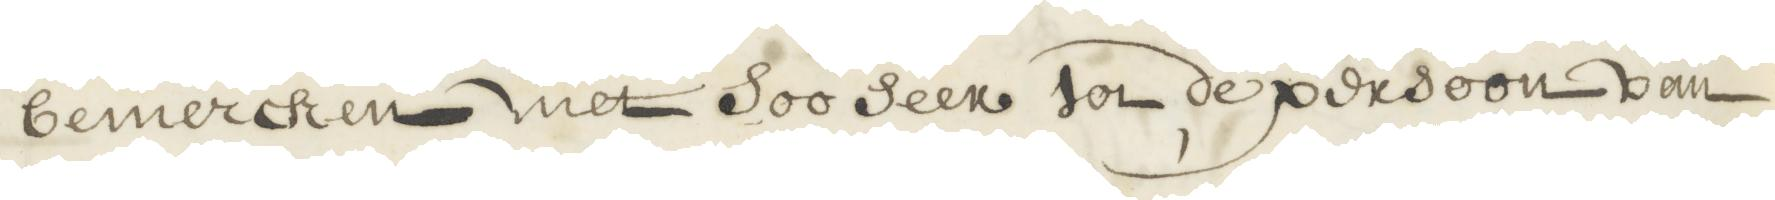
bemercken niet soo seer tot de persoon van
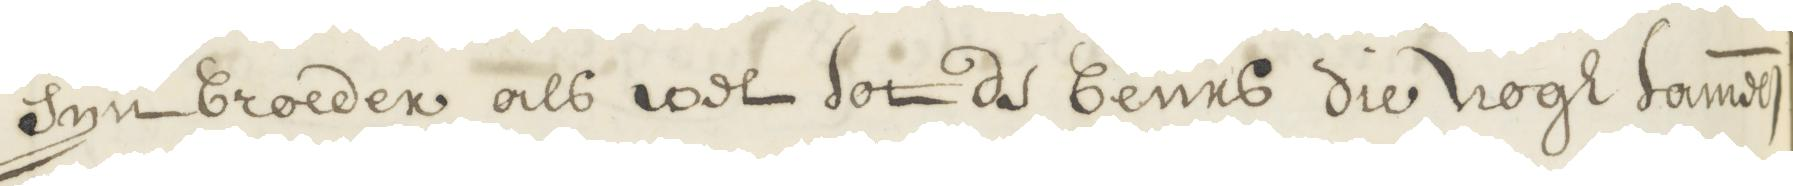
syn broeder als wel tot de beurs die nogh tamelijk
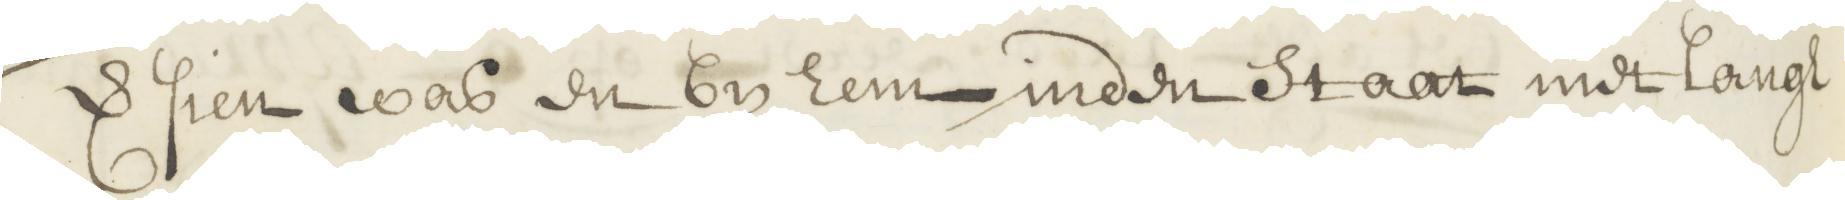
versien was en by hem inden staat niet langh
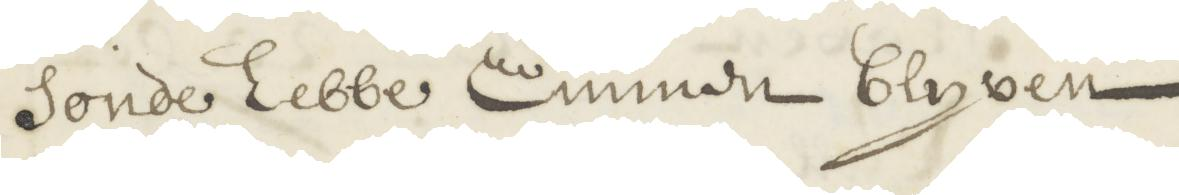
soude hebbe Cunnen blyven
